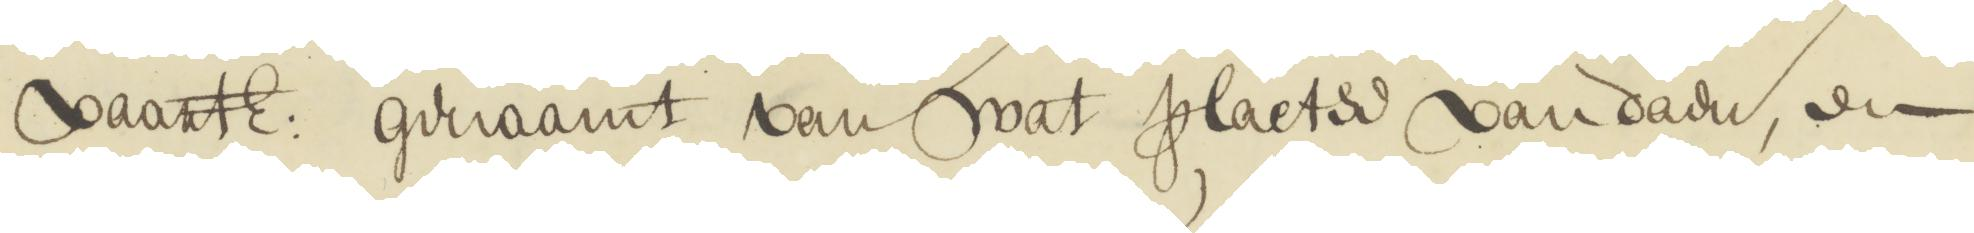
vaarth: genaamt van wat plaetse van daen, en
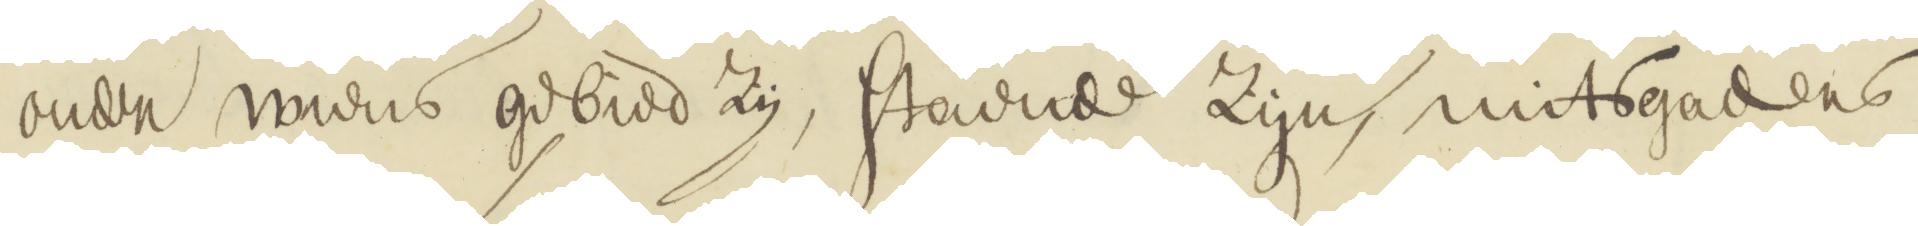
onder wiens gebied Zij, Staende Zijn, mitsgaders
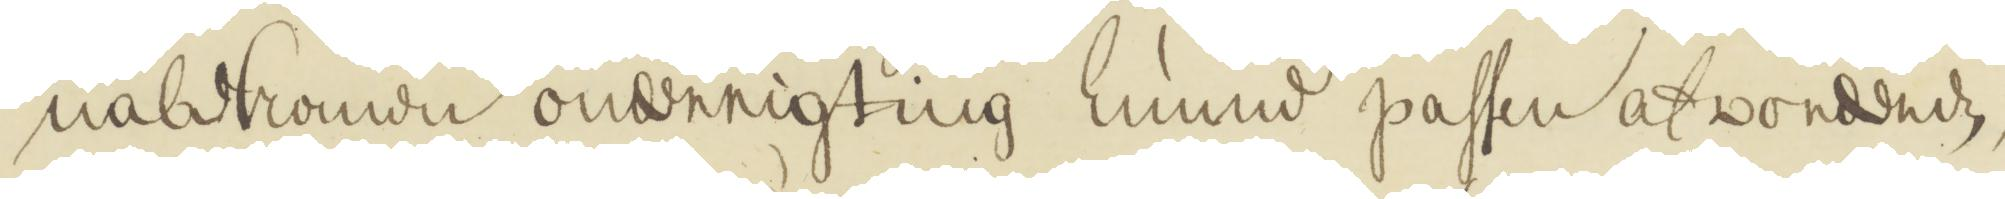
nabekomen onderrigting hunne passen afvorderen,
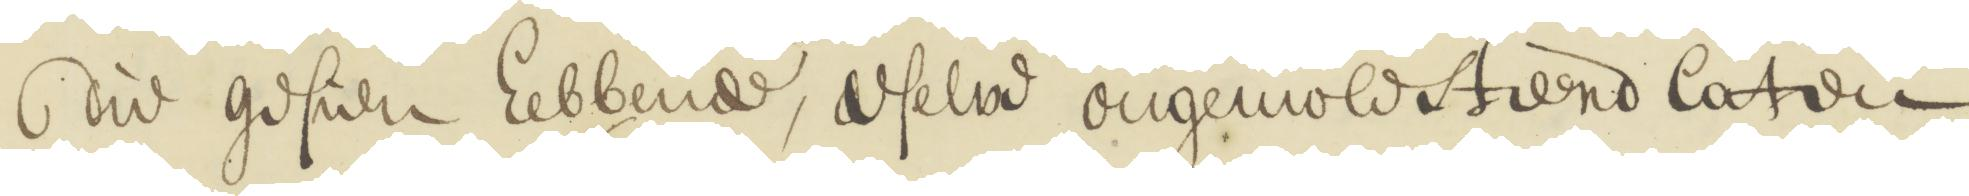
die gesien hebbende, deselve ongemolesteerd laten
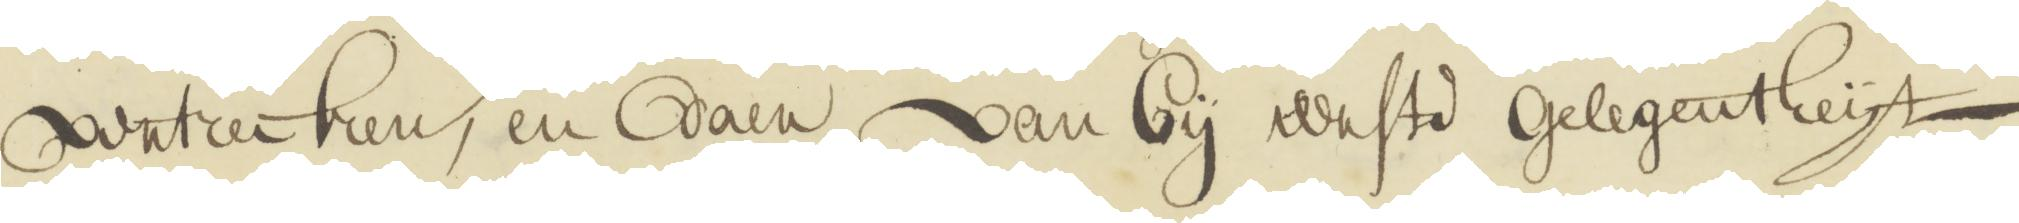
vertrecken, en daer van bij eerste Gelegentheijt
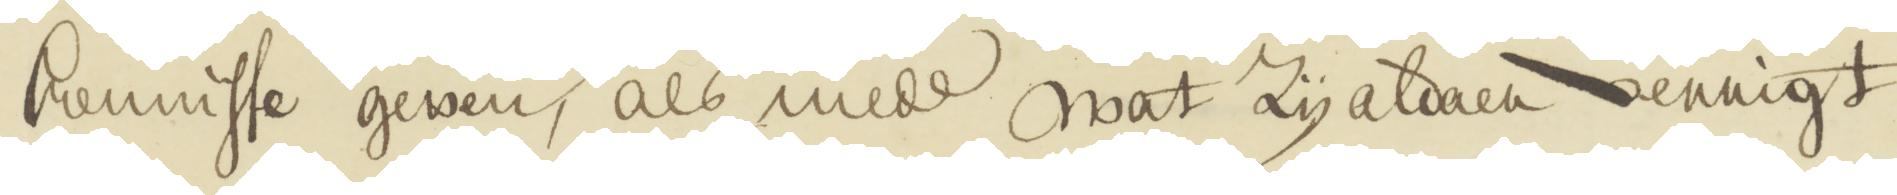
kennisse geven, als mede wat Zij aldaer verrigt
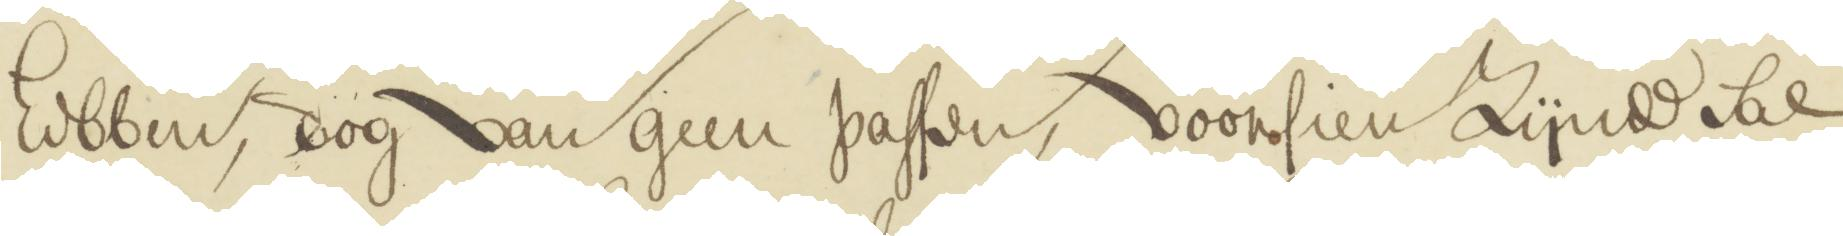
hebben, dog van geen passen, voorsien Zijnde Sal
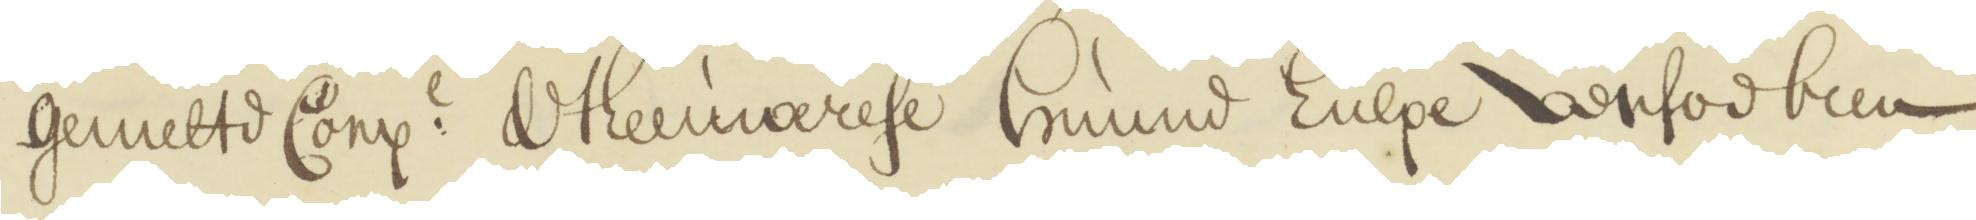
gemelte Corp:l de theeuwerese hunne hulpe versoeken
